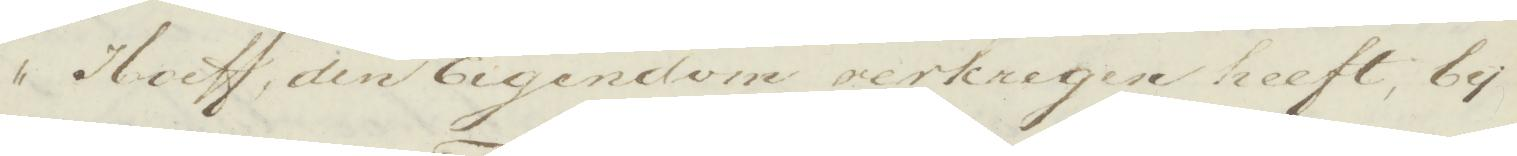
„ Hoeff, den Eigendom verkregen heeft, bij
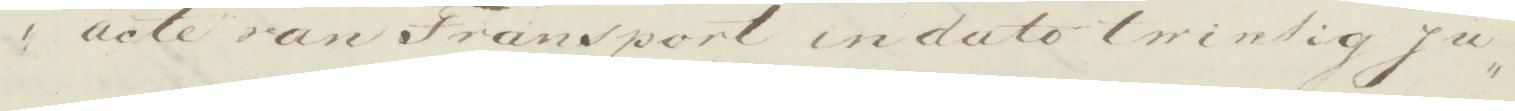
„acte van Transport in dato twintig Ju„
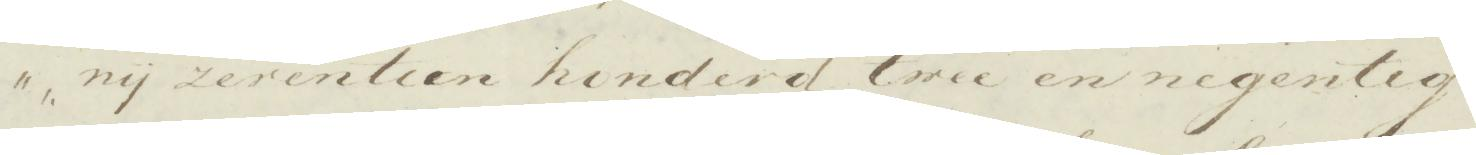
„nij zeventien honderd twee en negentig
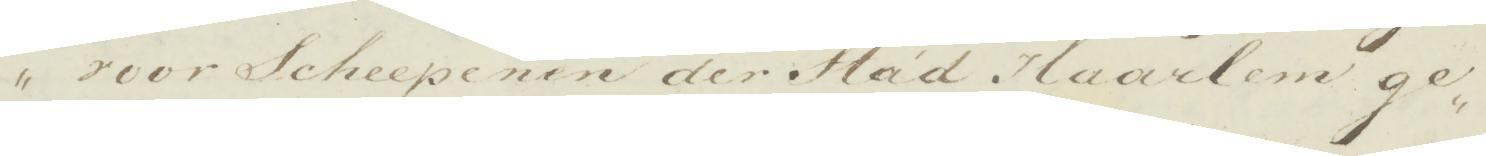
„ voor scheepenen der stad Haarlem ge„
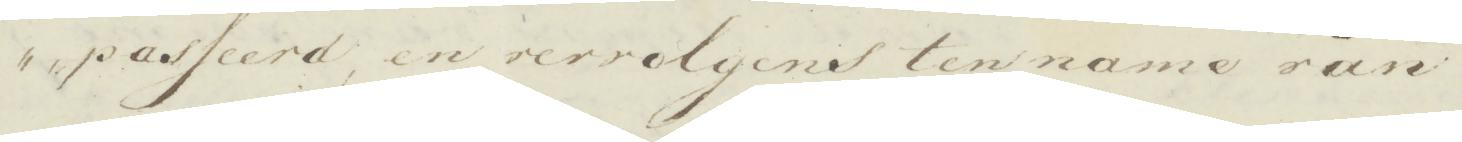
„„passeerd, en vervolgens ten name van
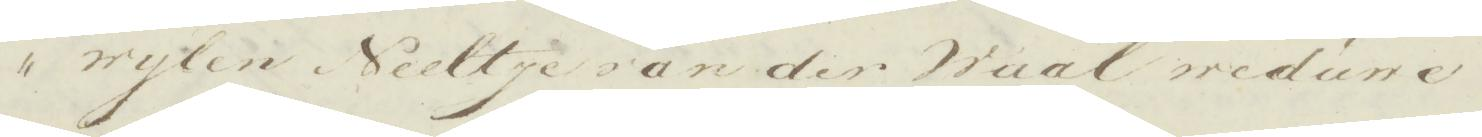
„wylen Neeltje van der Waal weduwe
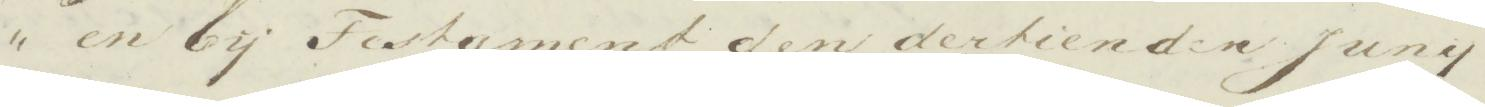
„ en bij Testament den dertienden Junij
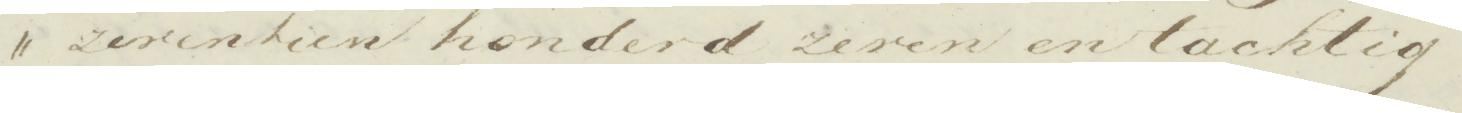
„zeventien honderd zeven en tachtig
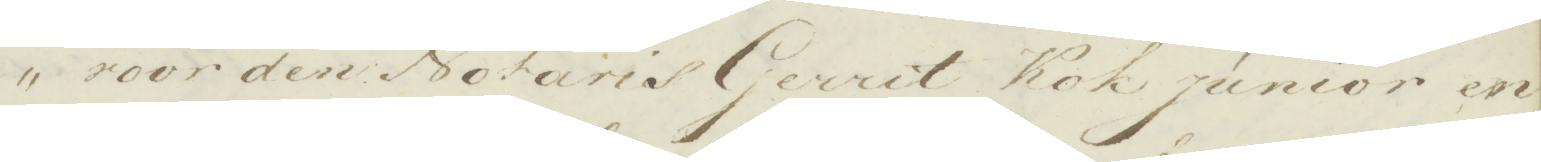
„ voor den Notaris Gerrit Kok junior en
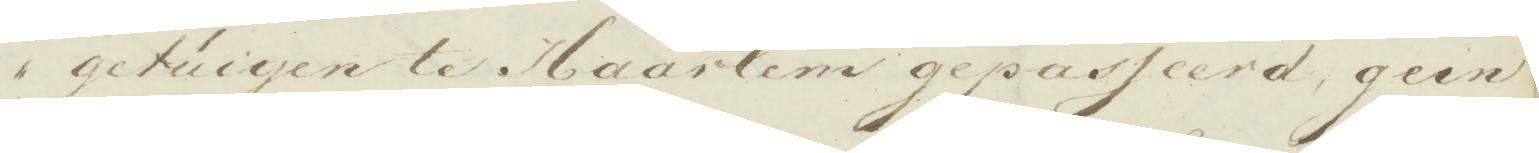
„getuigen te Haarlem gepasseerd, gein
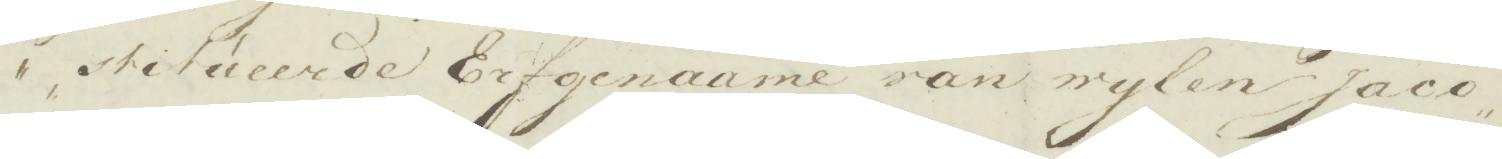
„ „stitueerde Erfgenaame van wylen Jaco„
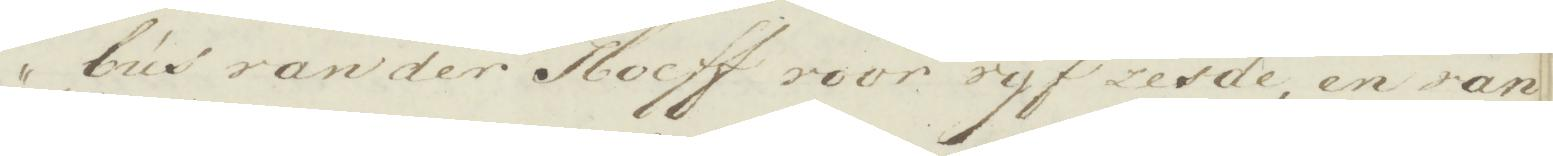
„bus van der Hoeff voor vyf zesde, en van
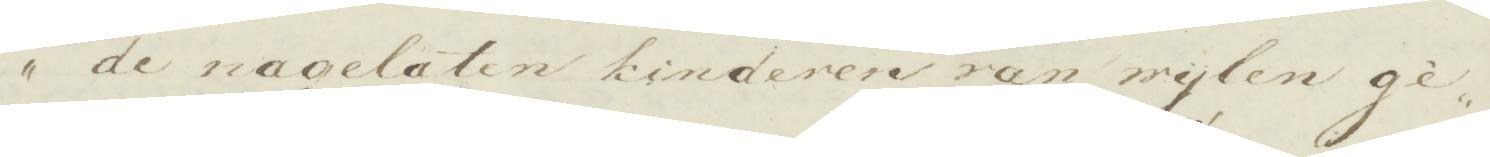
„ de nagelaten kinderen van wijlen ge„
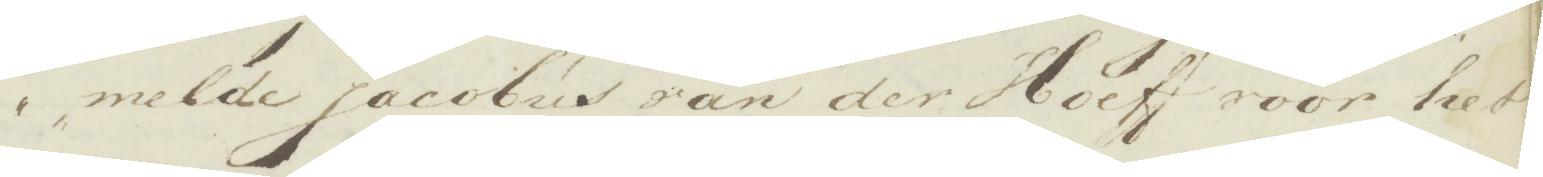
„„melde Jacobus van der Hoeff voor het
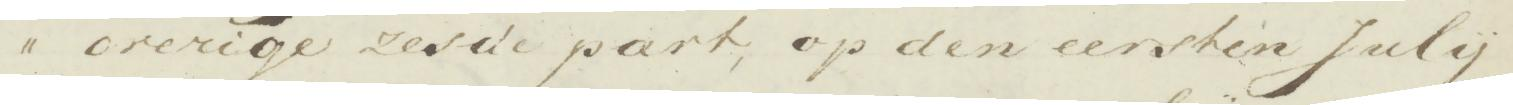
„ overige zesde part, op den eersten Julij
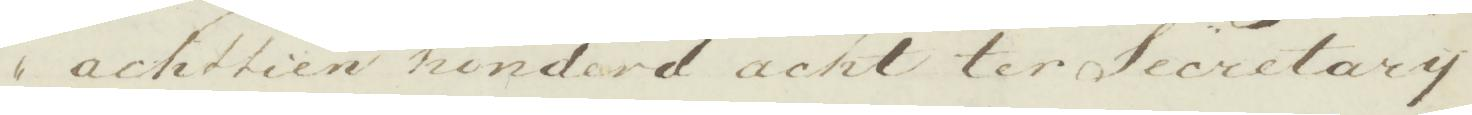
„ achttien honderd acht ter secretarij
